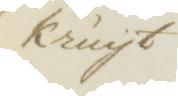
kruijt
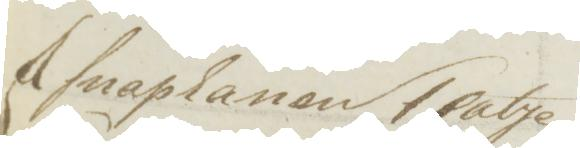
4 snaphanen, 1 Catje
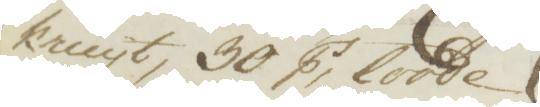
kruijt, 30 p„s loode
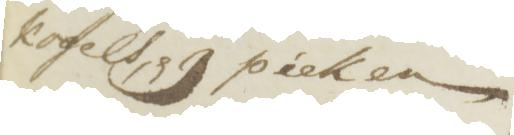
kogels, en 9 pieken
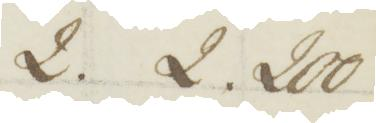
2. 2. 200
